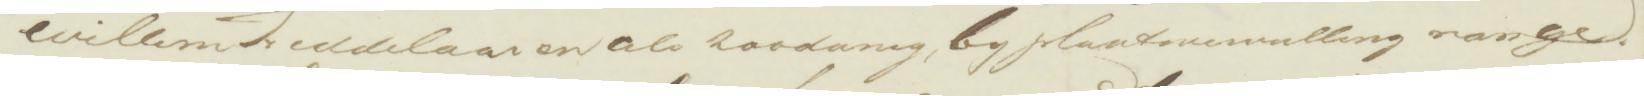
willem Fiddelaar en als zoodanig, by plaatsvervullling van ge.
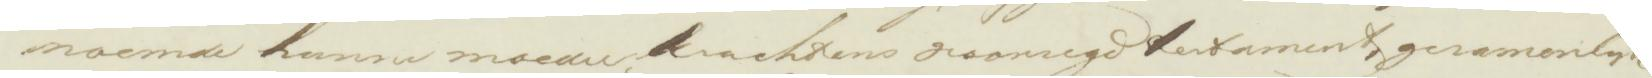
.noemde hunne moeder, krachtens voorzegd testament gezamenlyk
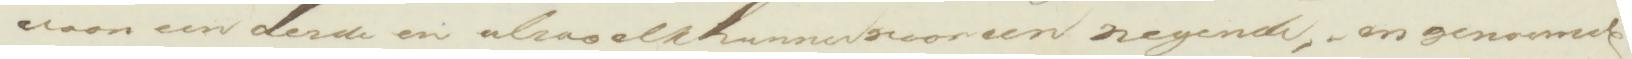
voor een derde en alzoo elk hunner voor een negende, en genoemde
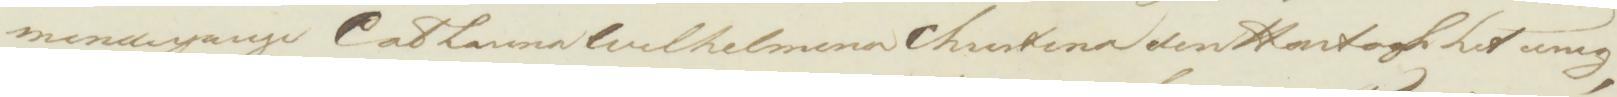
minderjarige Catharina Wilhelmina Christina den Hartogh het eenig
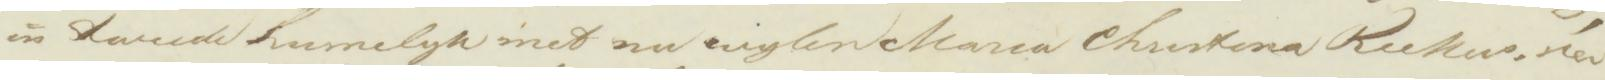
in tweede humelyk met nu wylen Maria Christina Reekers, ver
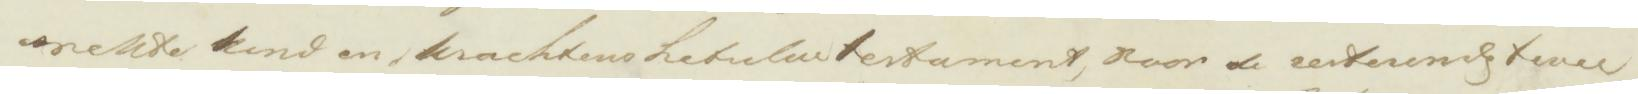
wekte kind en, krachtens hetzelve testament, voor de resterenden twee
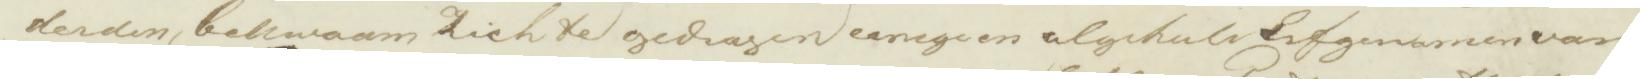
derden, bekwaam zich te gedragen eenige en algehele Erfgenamen van
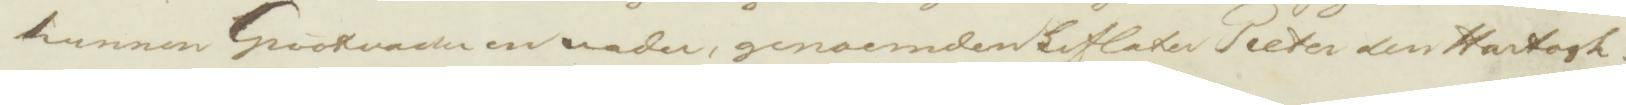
hunnen Grootvader en vader, genoemden Erflater Pieter den Hartogh
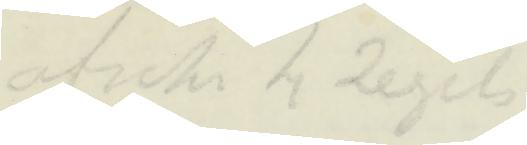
afschr 4 zegels
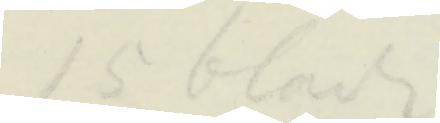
15 bladen
